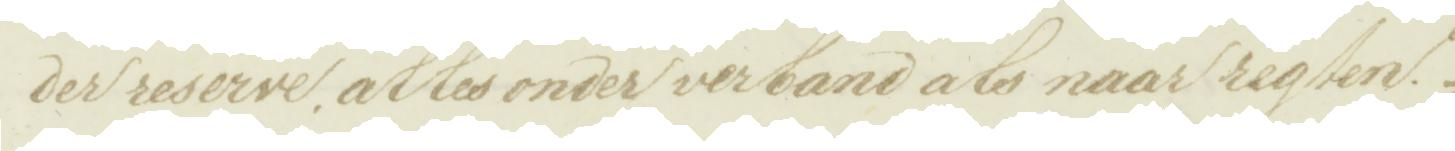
der reserve, alles onder verband als naar regten.
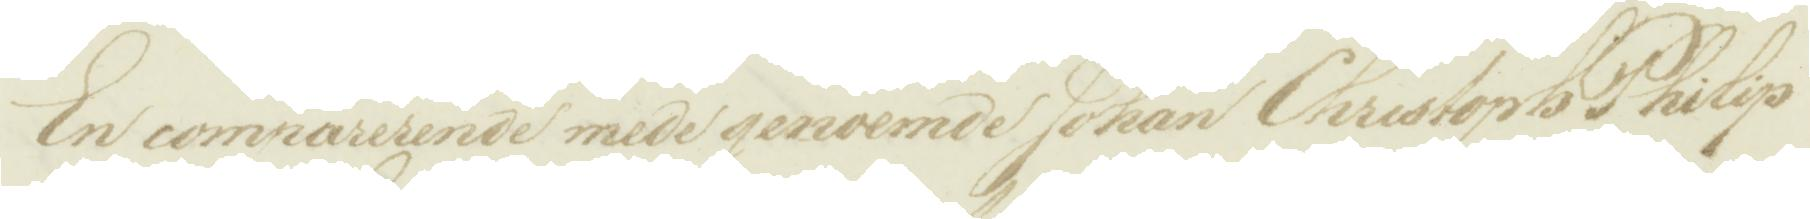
En comparerende mede genoemde Johan Christoph Philip
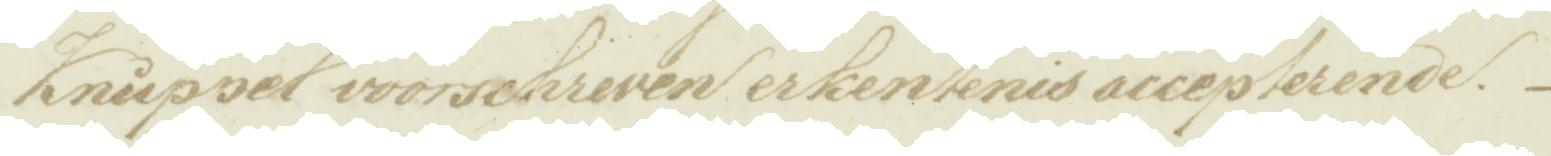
Knuppel voorschreven erkentenis accepterende. -
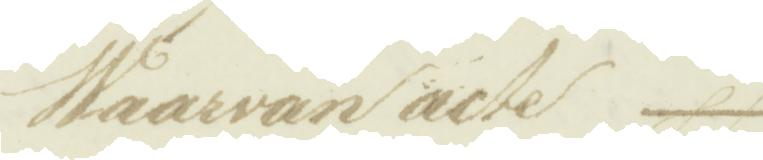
Waarvan acte —
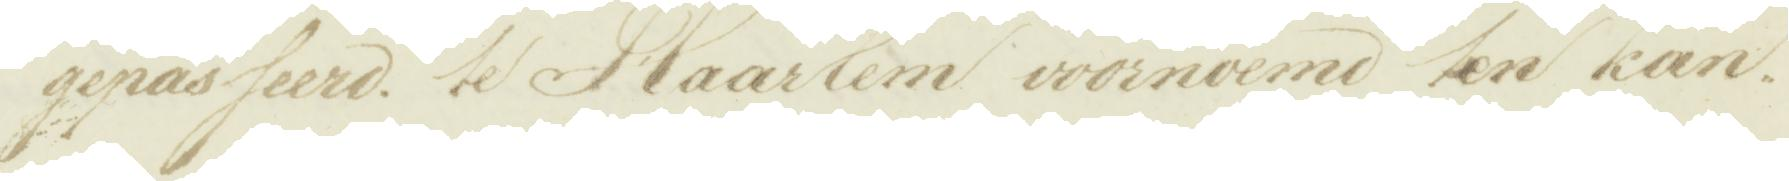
gepasseerd. te Haarlem voornoemd ten kan„
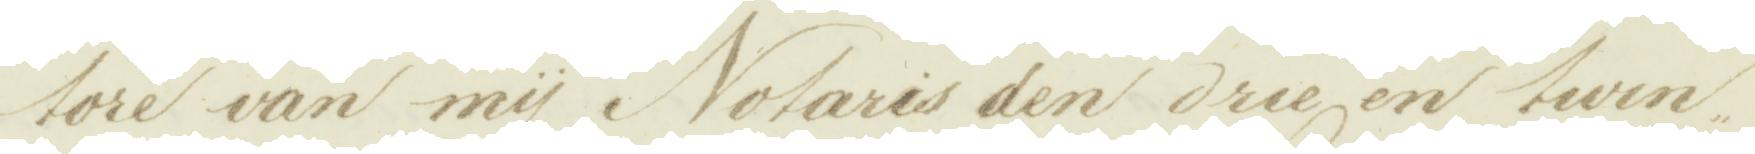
tore van mij Notaris den drie en twin„
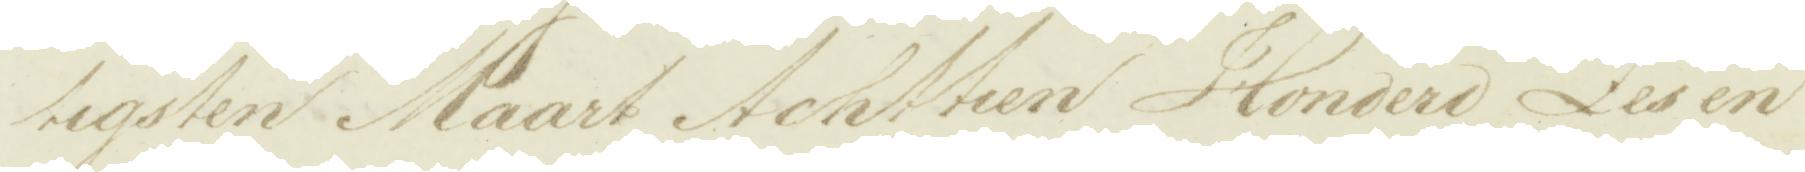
tigsten Maart Achttien Honderd Zes en
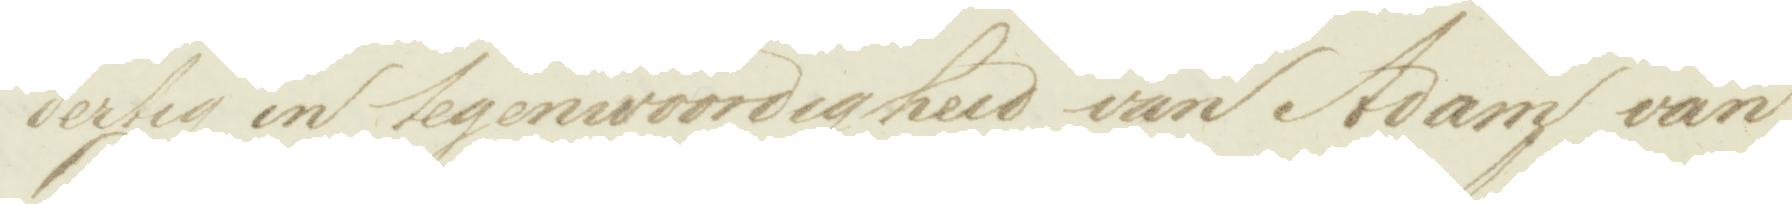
dertig in tegenwoordigheid van Adam van
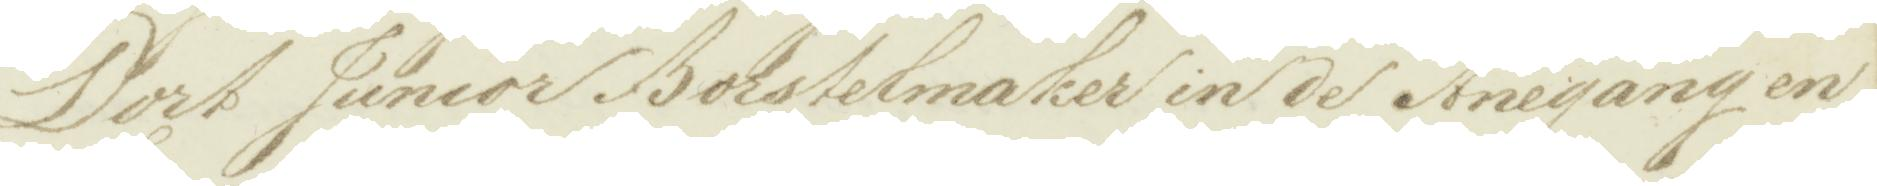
Dort Junior Borstelmaker in de Anegang en
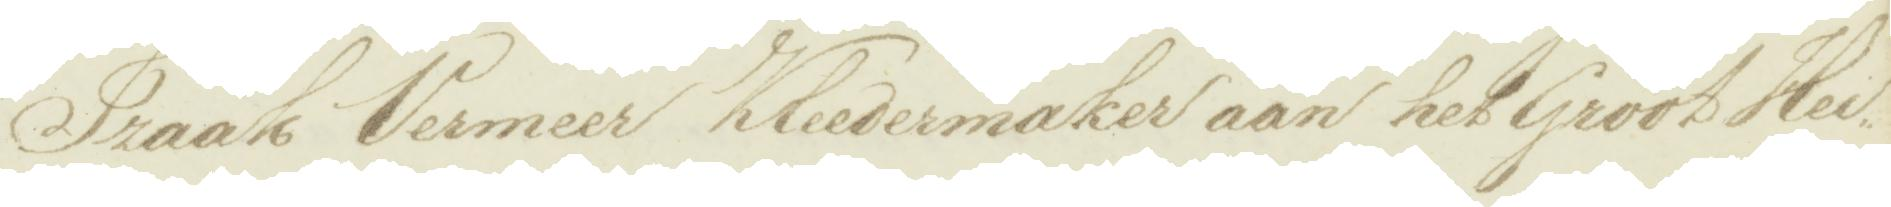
Izaak Vermeer Kleedermaker aan het Groot Hei„
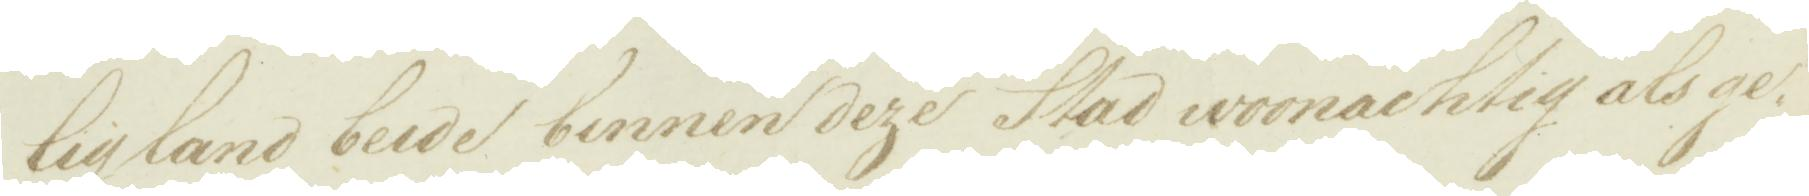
ligland beide binnen deze Stad woonachtig als ge„
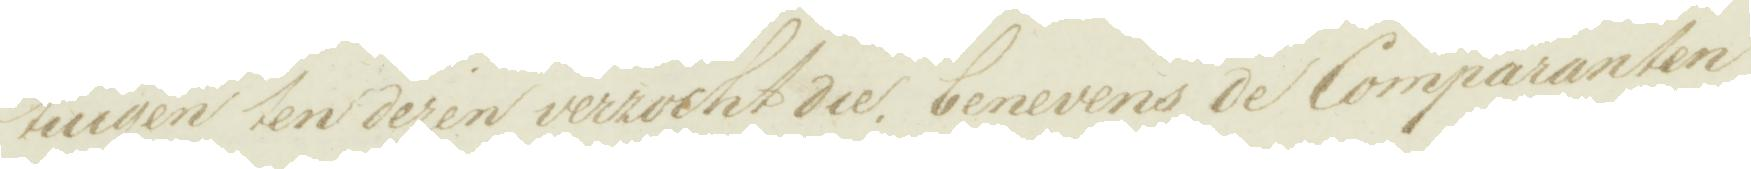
tuigen ten dezen verzocht die, benevens de Comparanten
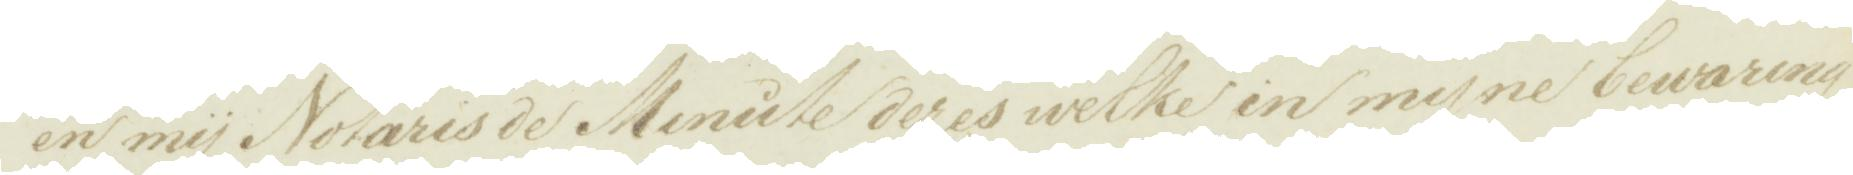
en mij Notaris de Minute dezes welke in mijne bewaring
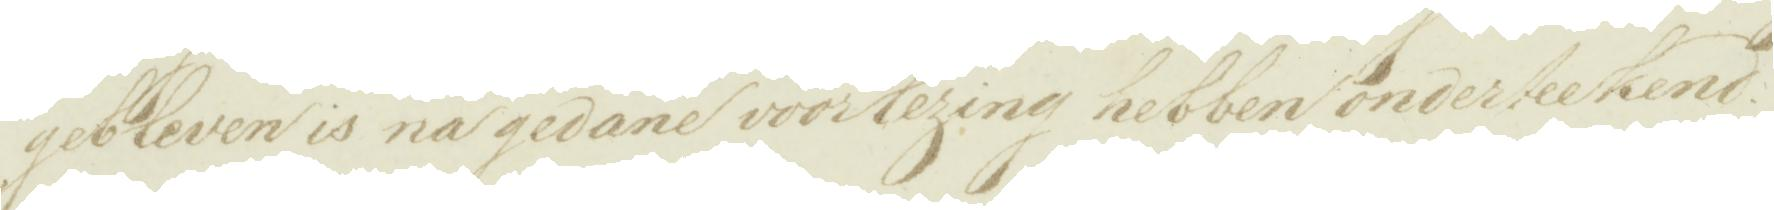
gebleven is na gedane voorlezing hebben onderteekend.
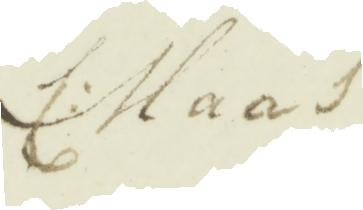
C: Maas
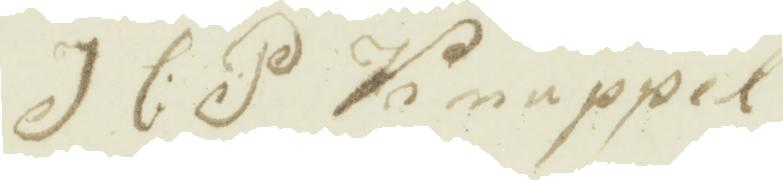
J C P Knuppel
